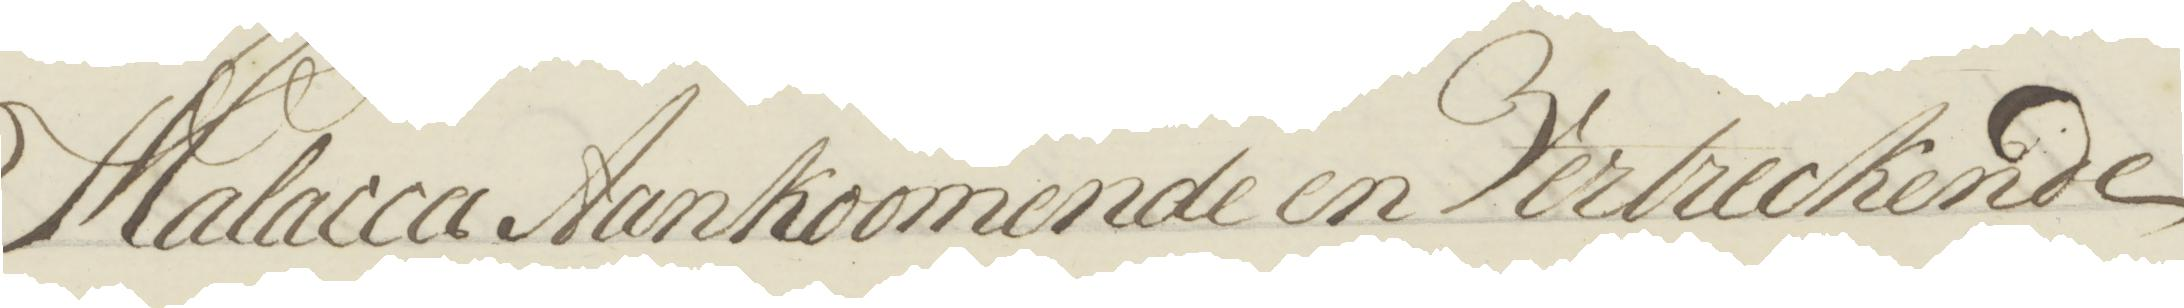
Malacca Aankoomende en Vertreckende
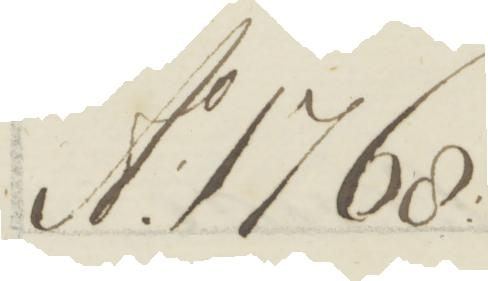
A:o 1768
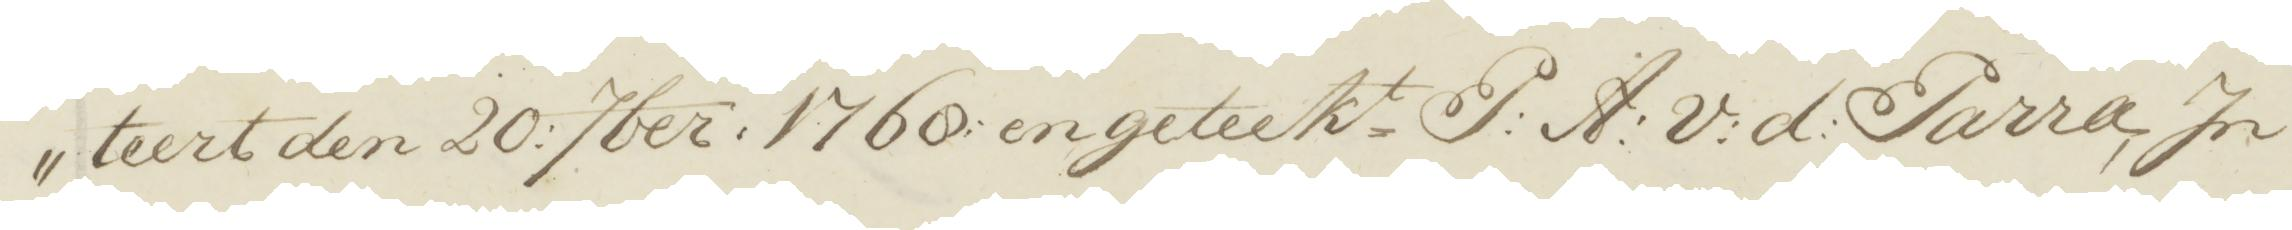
„teert den 20: 7ber: 1768: en geteek=t P: A: v: d: Parra Jn
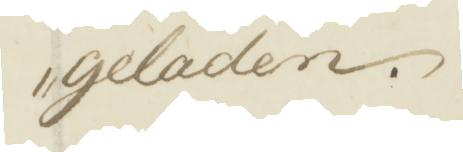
„geladen.
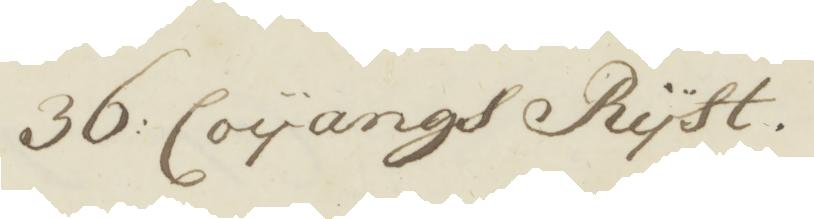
36: Coijangs Rijst.
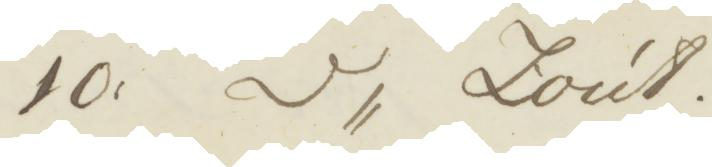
10: _o„ Zout.
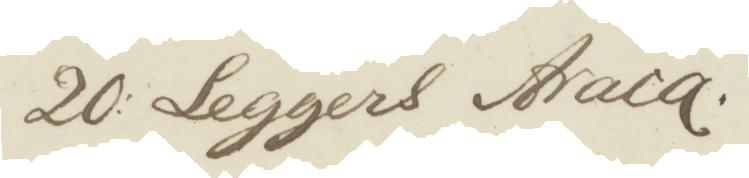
20: Leggers Aracq.
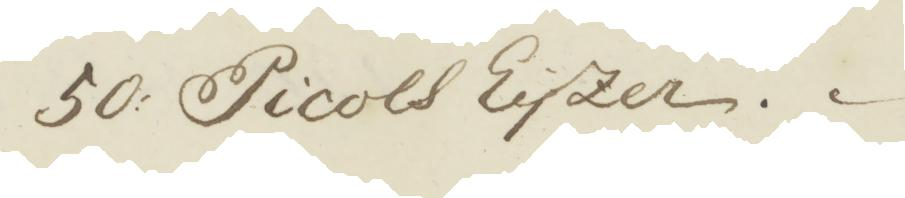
50: Picols Eijzer.
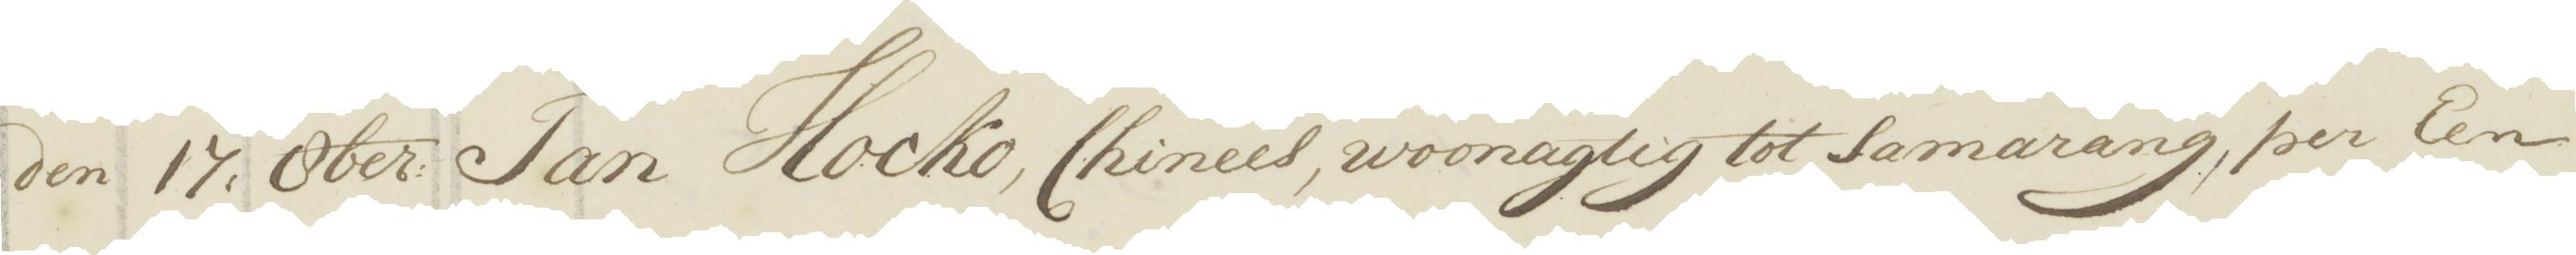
den 17: 8ber: Tan Hocko, Chinees, woonagtig tot Samarang, per Een
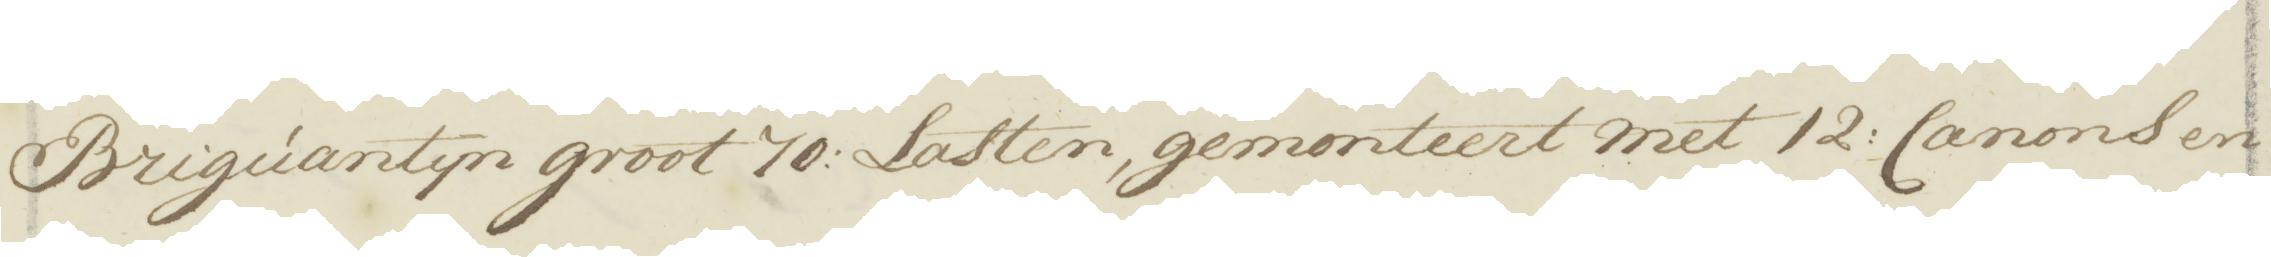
Briguantijn groot 70: Lasten, gemonteert met 12: canons en
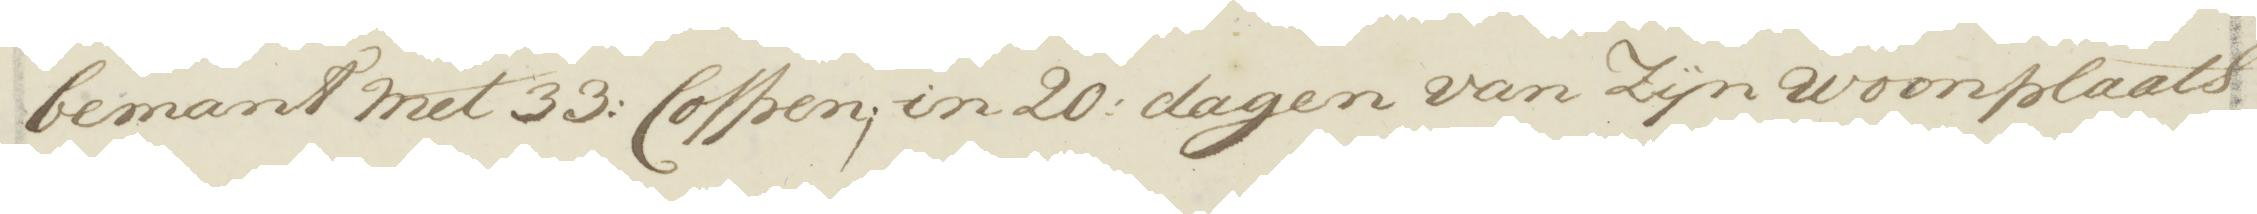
bemant met 33: coppen, in 20: dagen van zijn woonplaats
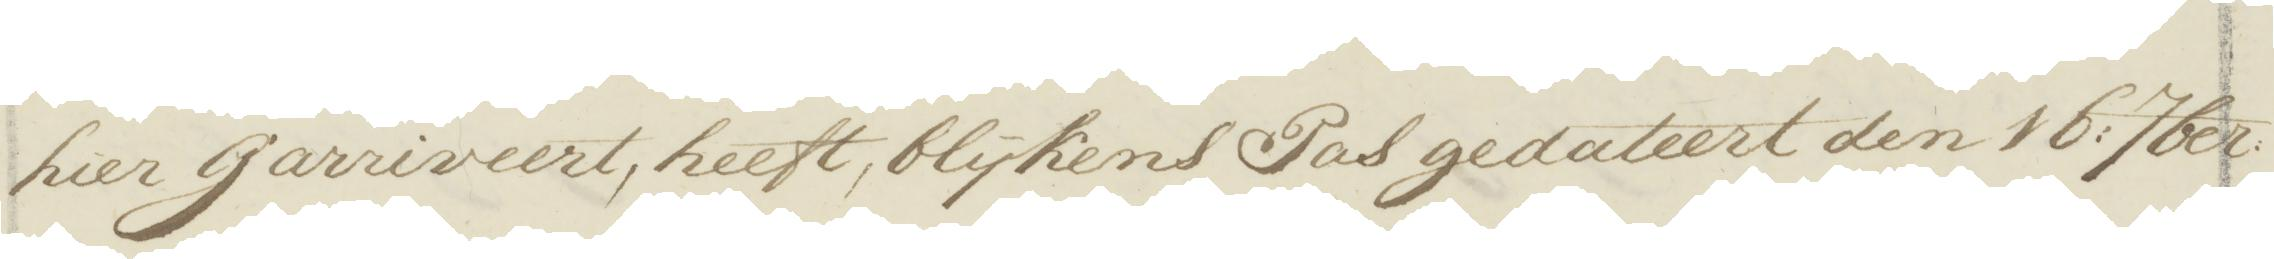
hier g'arriveert, heeft, blijkens Pas gedateert den 16: 7ber
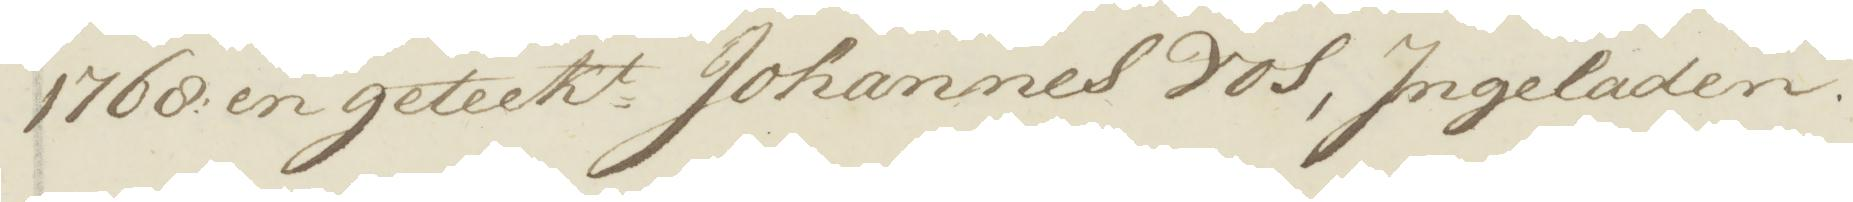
1768: en geteek=t Johannes Vos, Jngeladen.
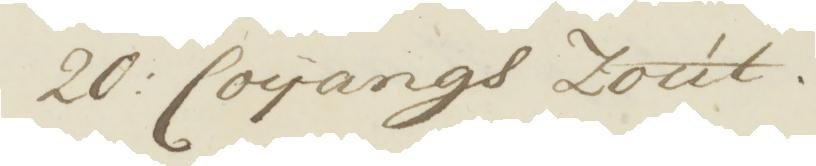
20: Coijangs Zout.
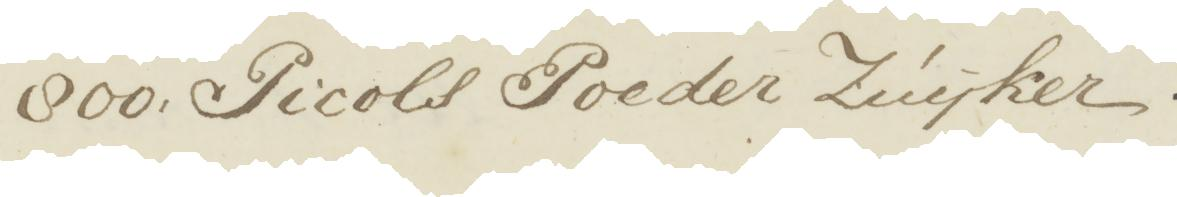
800: Picols Poeder Zuijker.
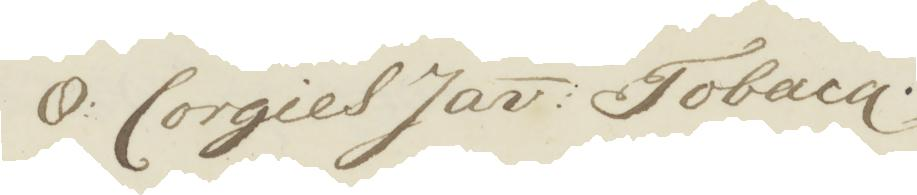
8: Corgies Jav: Tobacq.
